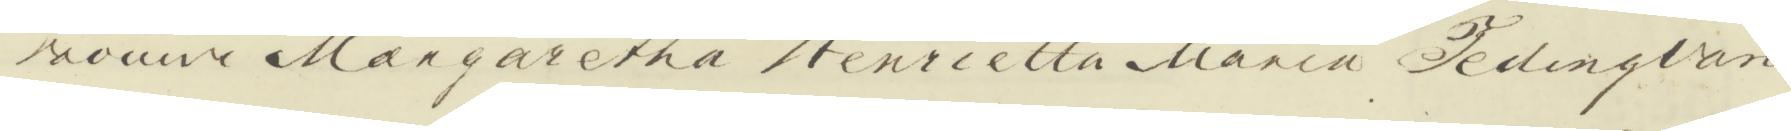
vrouwe Margaretha Henrietta Maria Teding van
